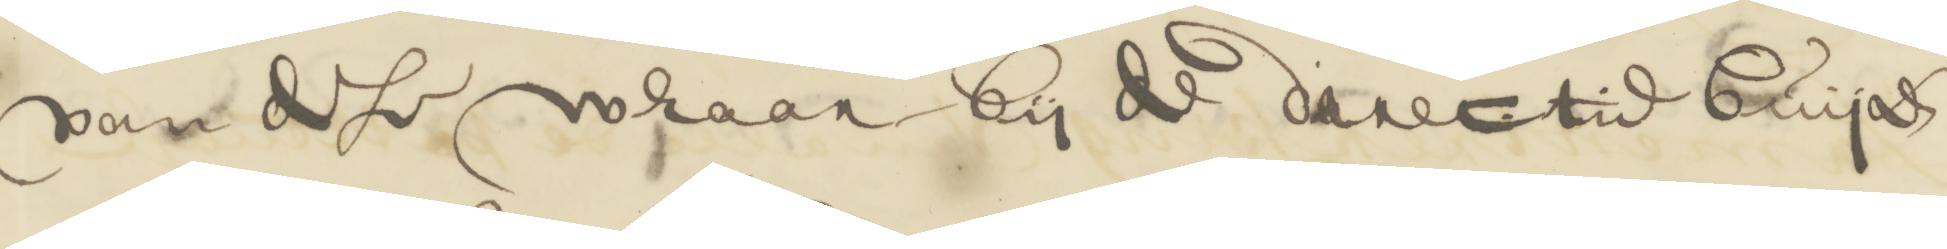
van dese whaar bij de directie buijten
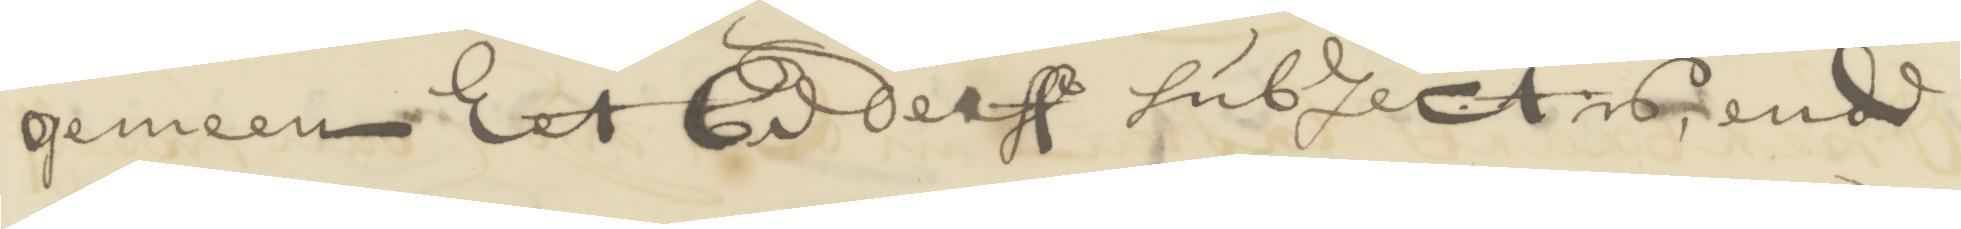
gemeen het bederff subject is, ende
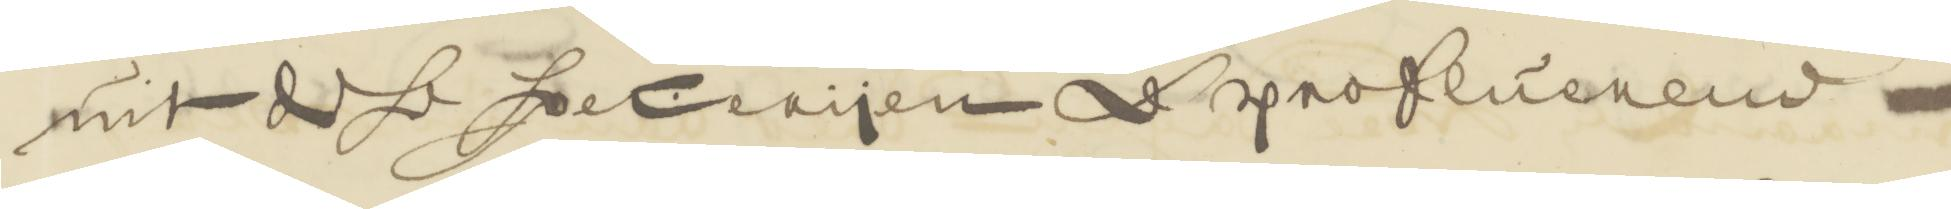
uit dese specerijen te profluerene
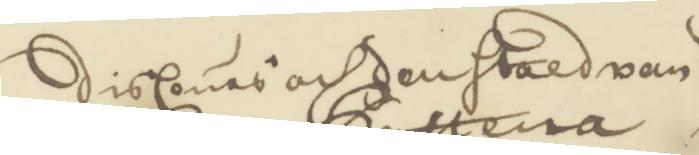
discours over den staed van
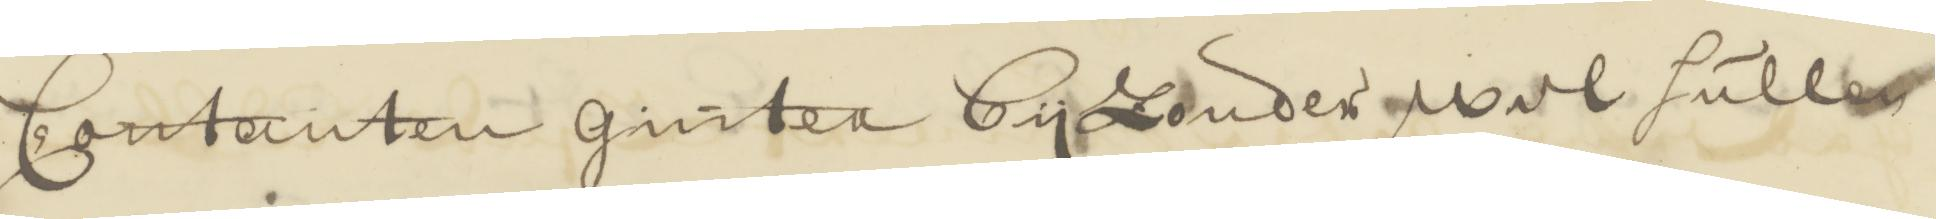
Contanten ginter bijzonder wel sullen
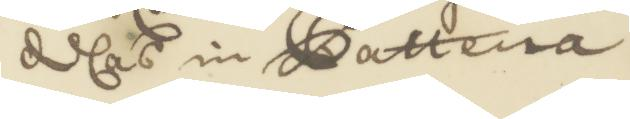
de cas in Pattena
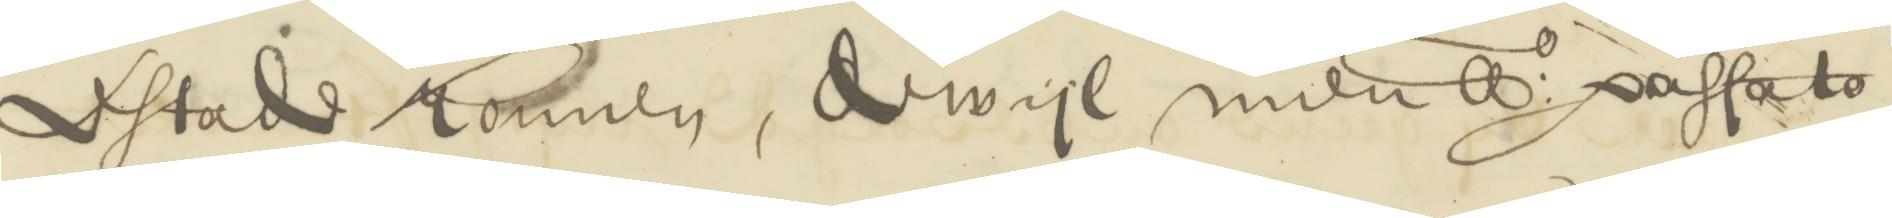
testade komen, dewijl men a:o passato
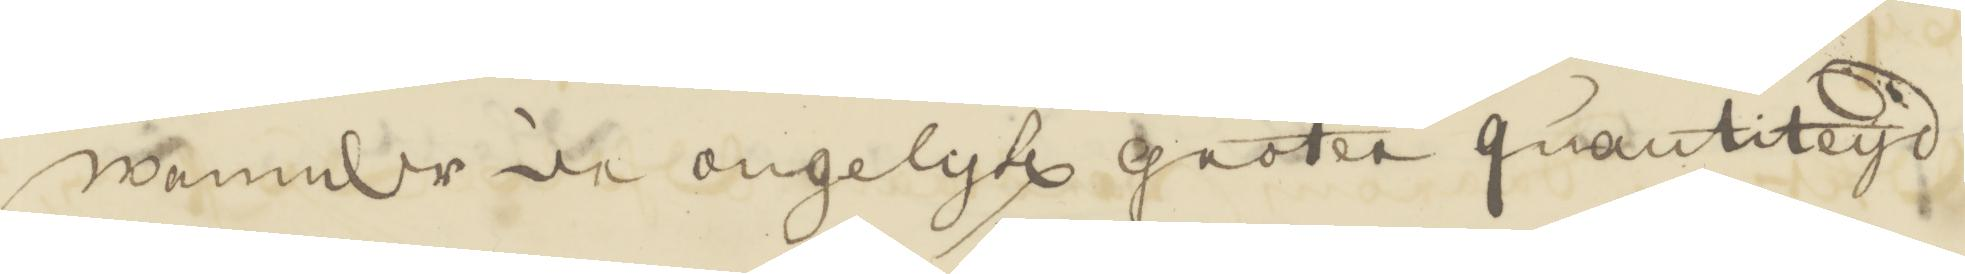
wanneer 'er ongelijk groter quantiteijd
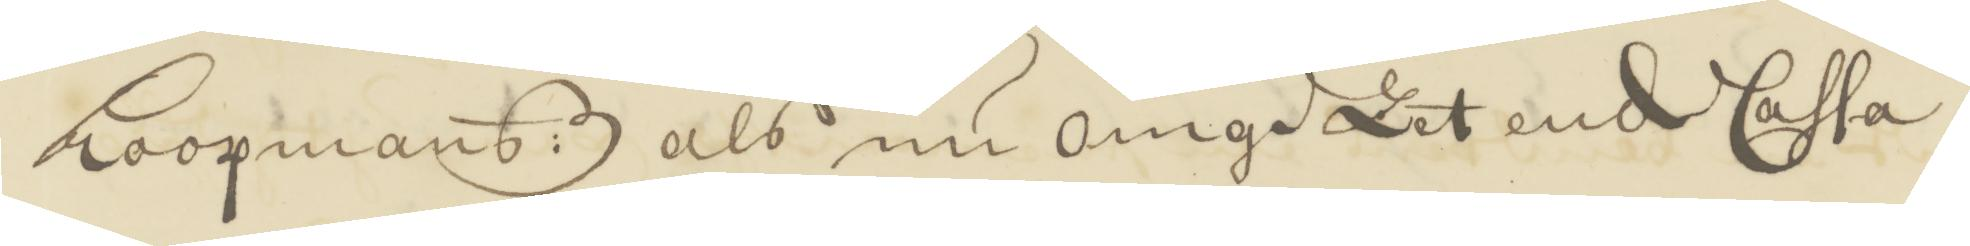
koopmans:z als nu omgezet ende Cassa
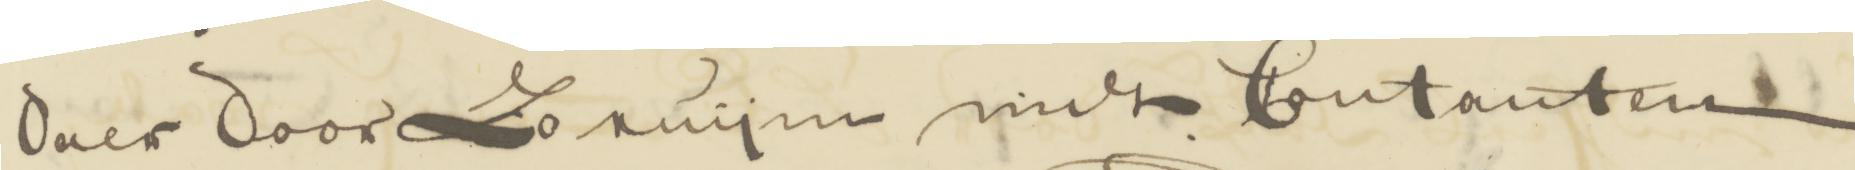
daer door zo ruijm met contanten
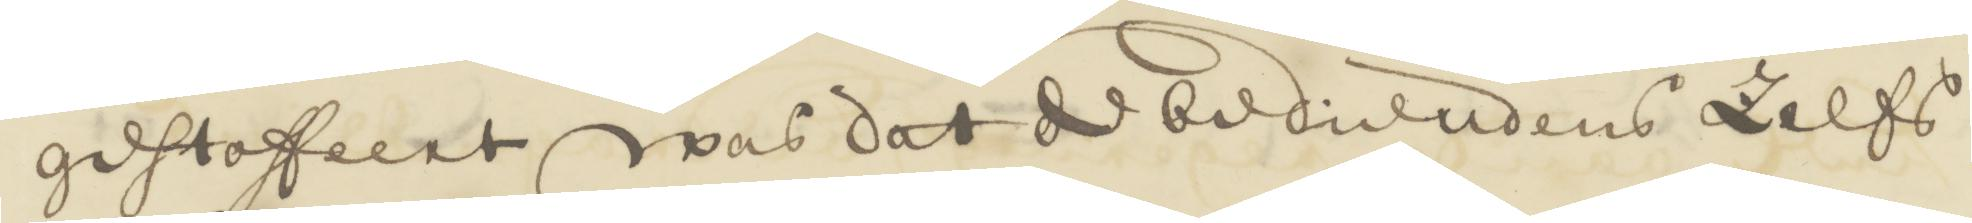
gestoffeert was dat de bediendens zelfs
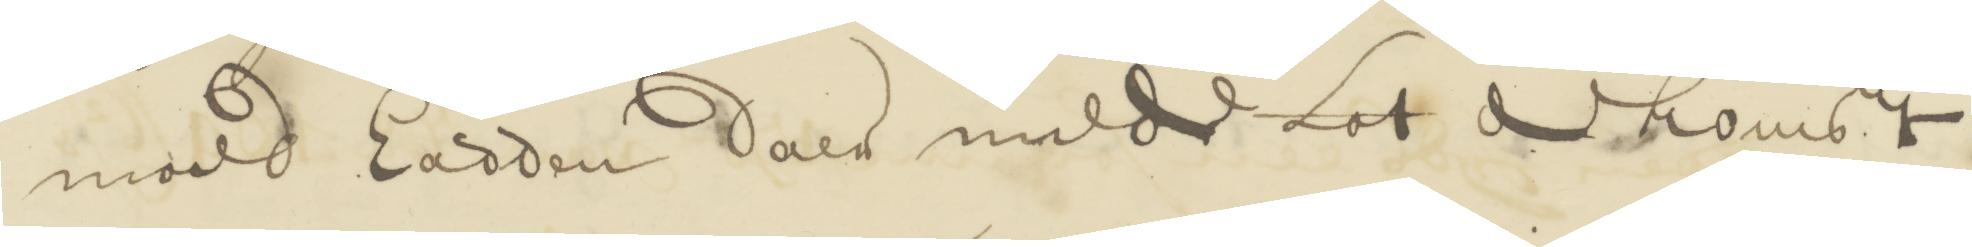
moed hadden daer mede tot de komst
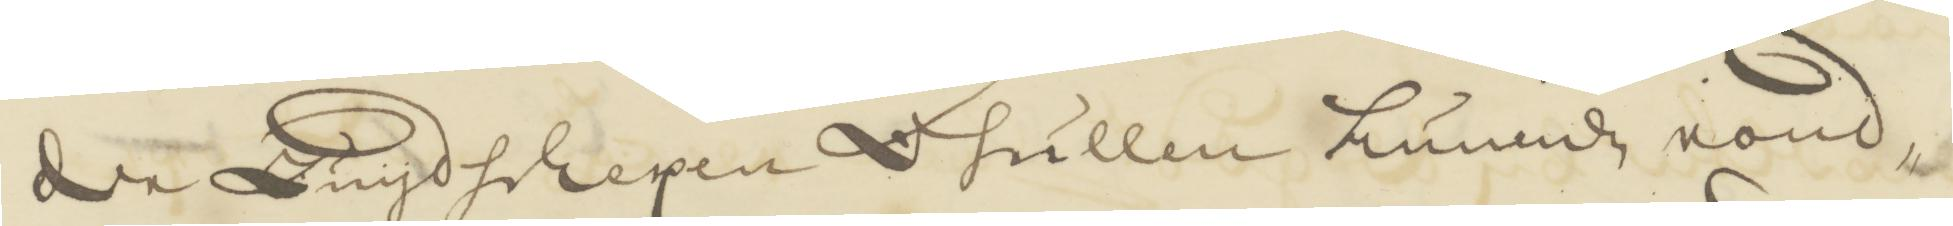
der zuijdschepen te sullen kunnen rond„
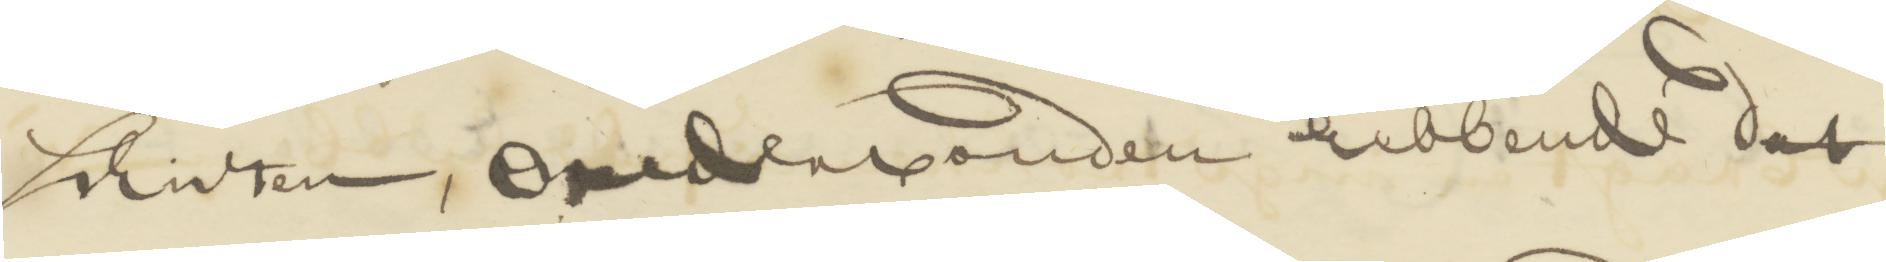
schieten, ondervonden hebbende dat
